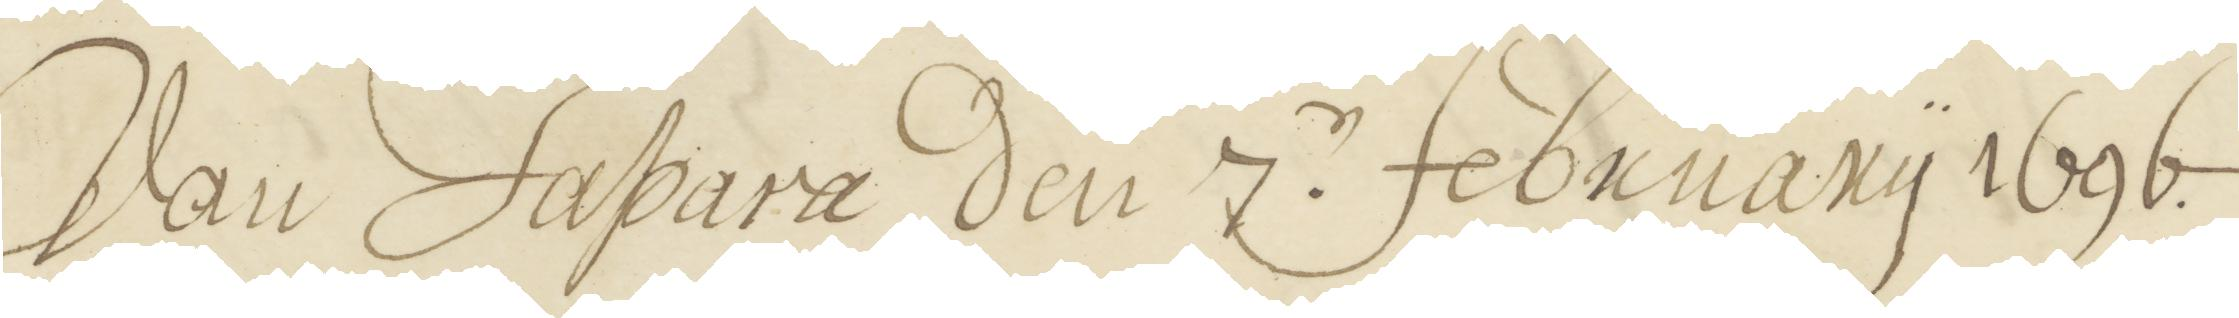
Van Japara den 7.n Februarij 1696.
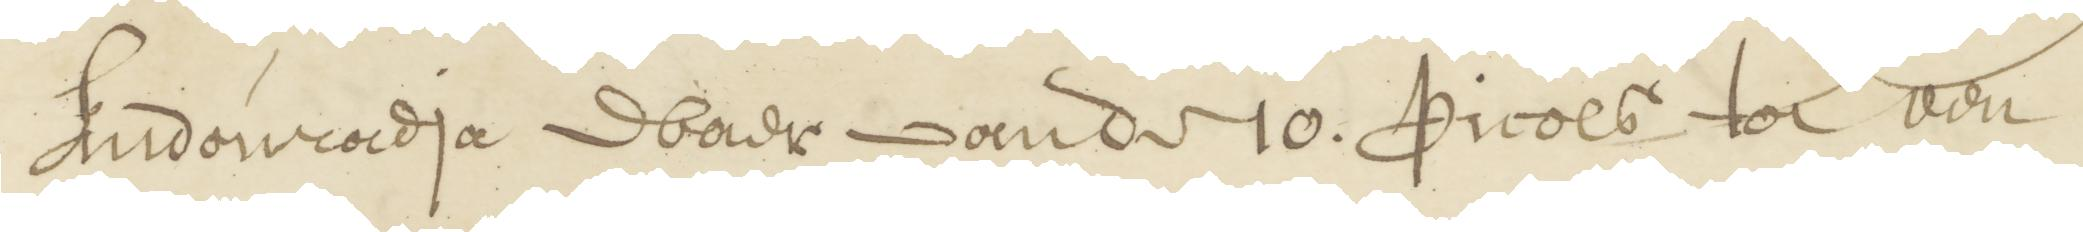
sindouradja waer vande 10. picols tot een
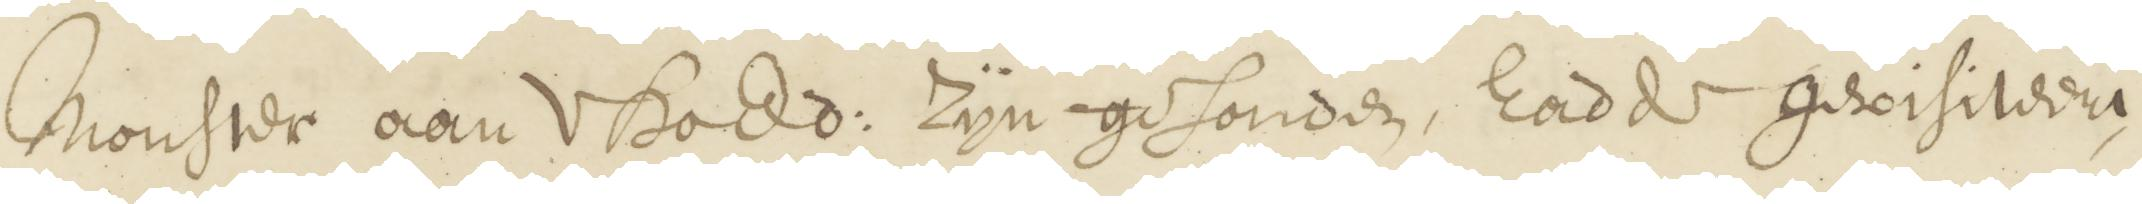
Monster aan VHoEd: zijn gesonden, hadde gevisiteert,
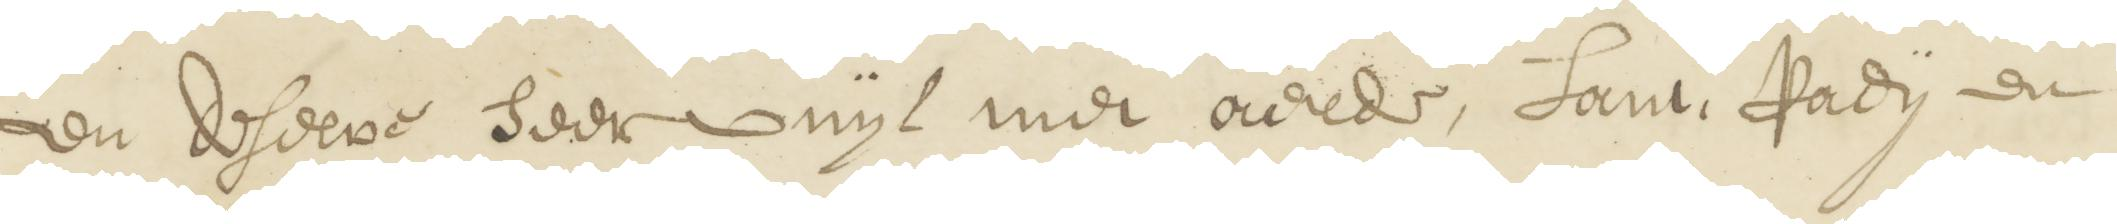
en deselve seer vuijl met aerde, sant, padij en
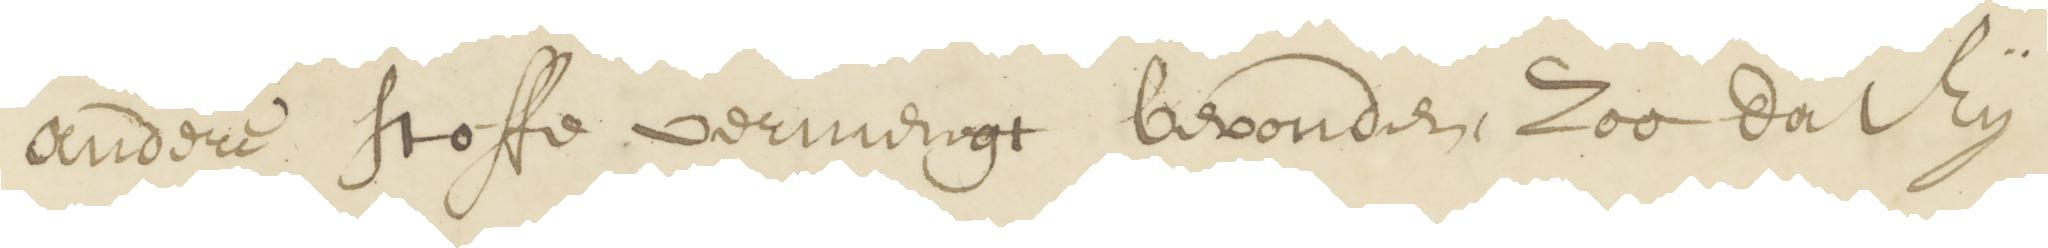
andere stoffe vermengt bevonden, zoo dat hij
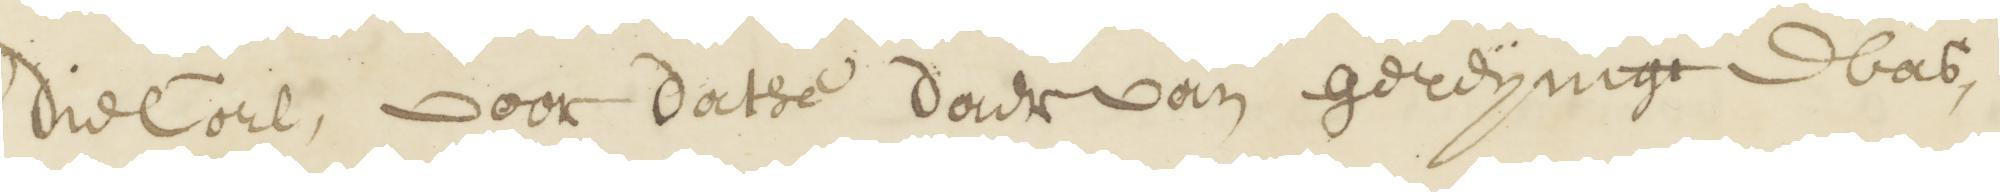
die Corl, voor datse daervan gereijnigt was,
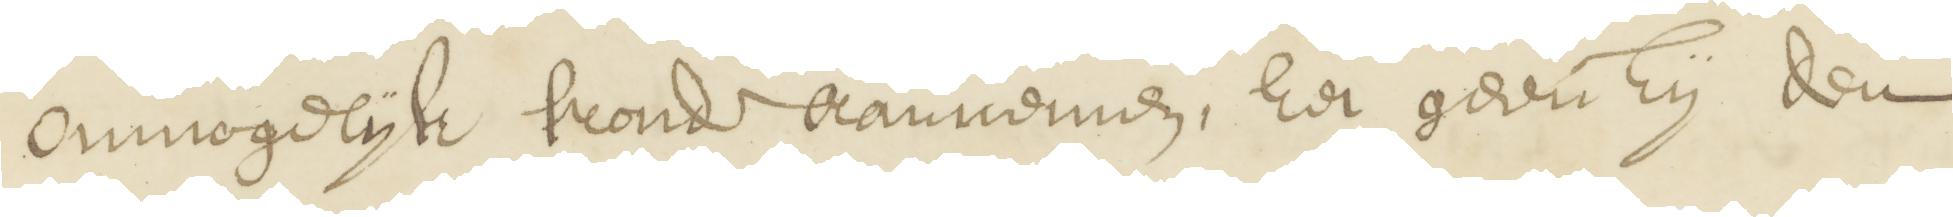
onmogelijk konde aannemen, het geen hij den
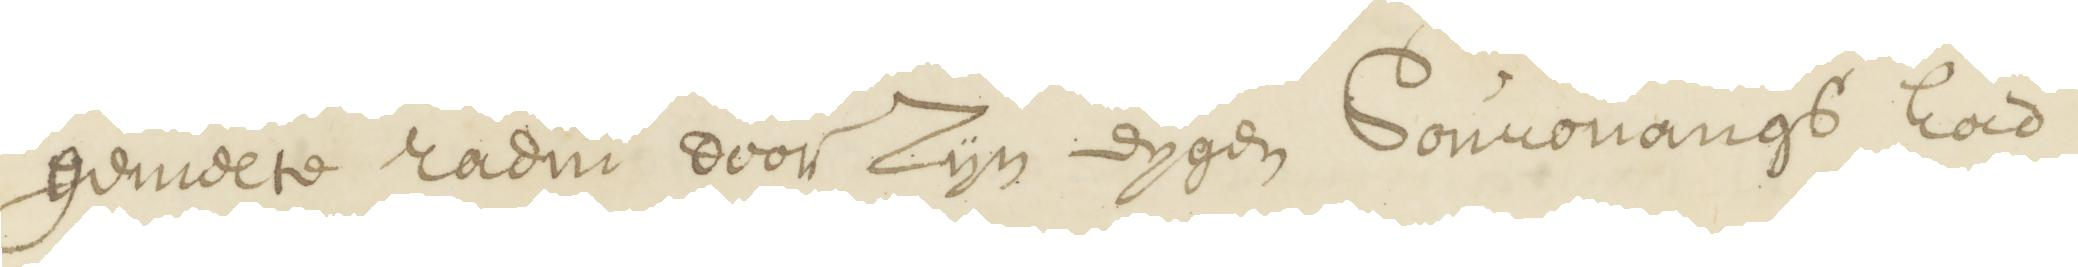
gemelte radin door zijn eijgen sourouangs had
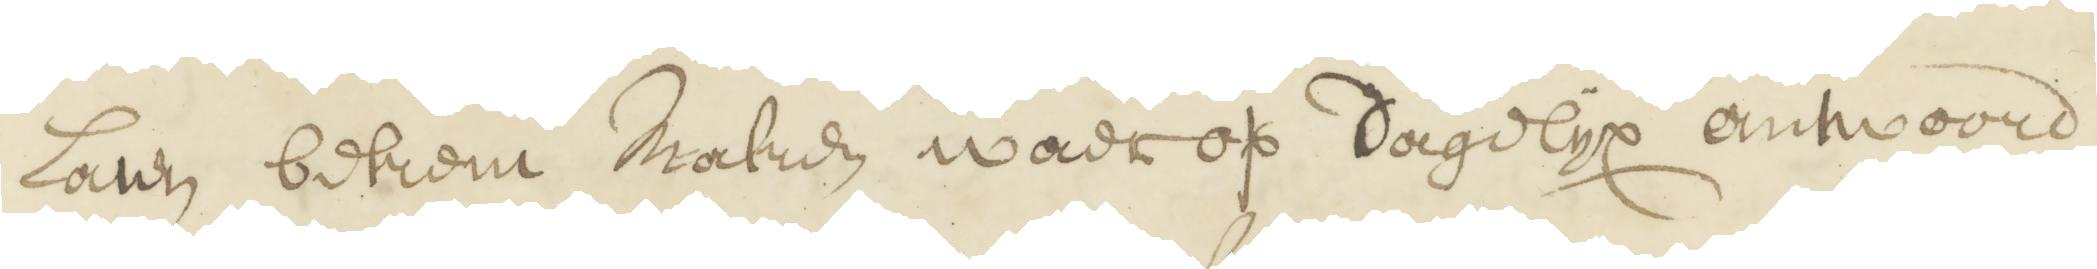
laten bekent maken waer op dagelijx antwoord
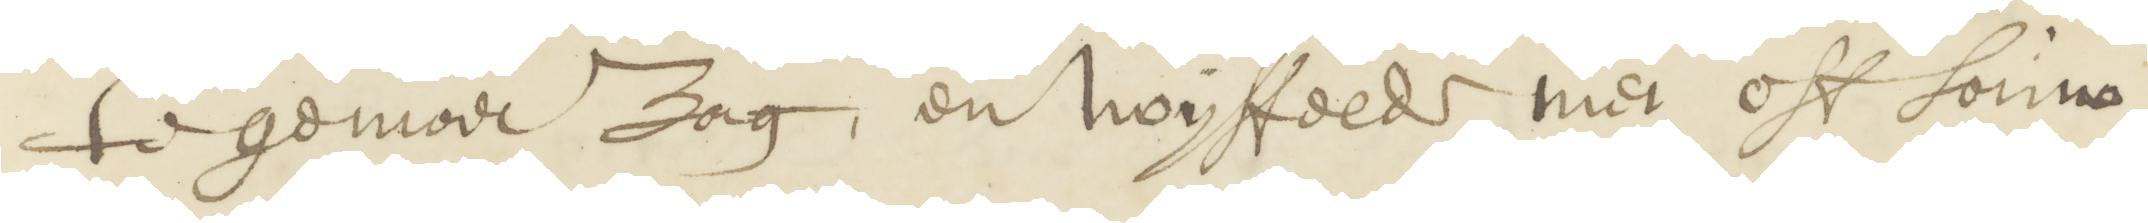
te gemoet zag, en twijffelde niet off souw
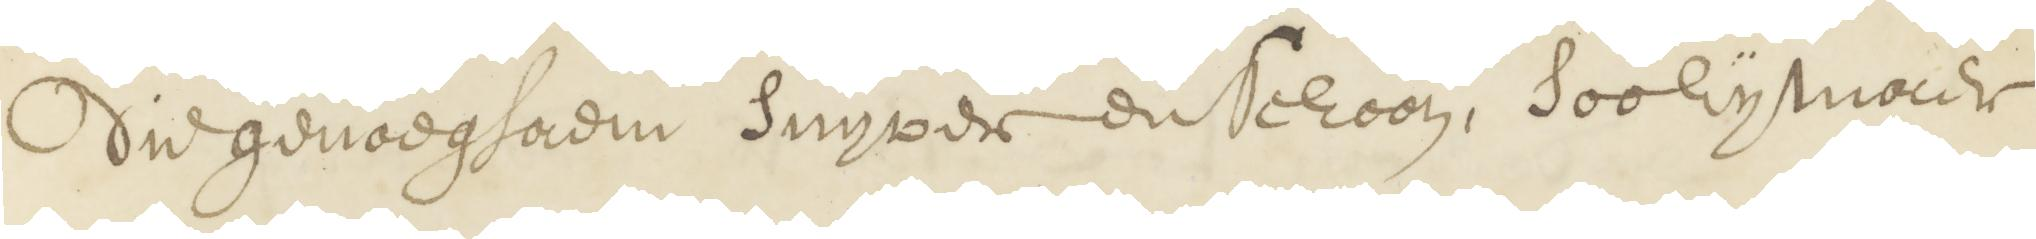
die genoegsaem suijver en schoon, soo hij maer
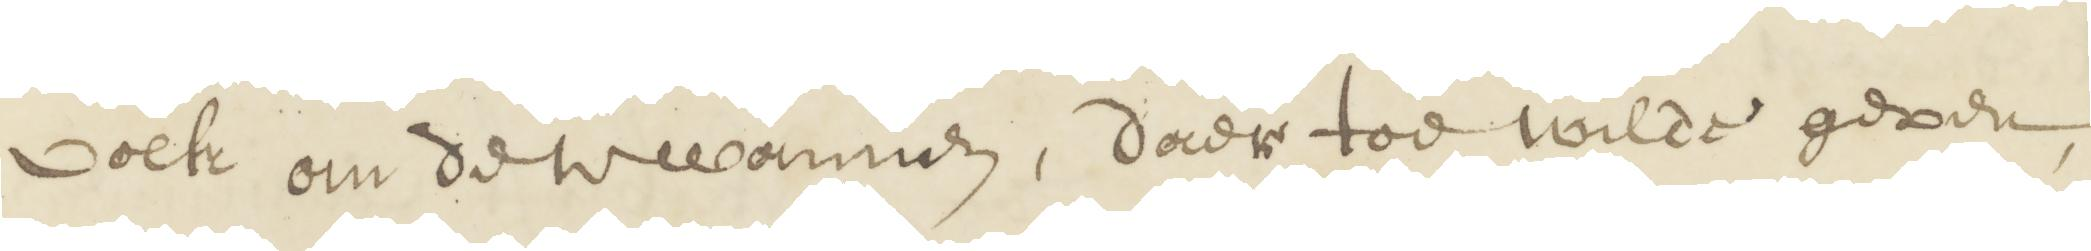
volk om de te wannen, daer toe wilde geven,
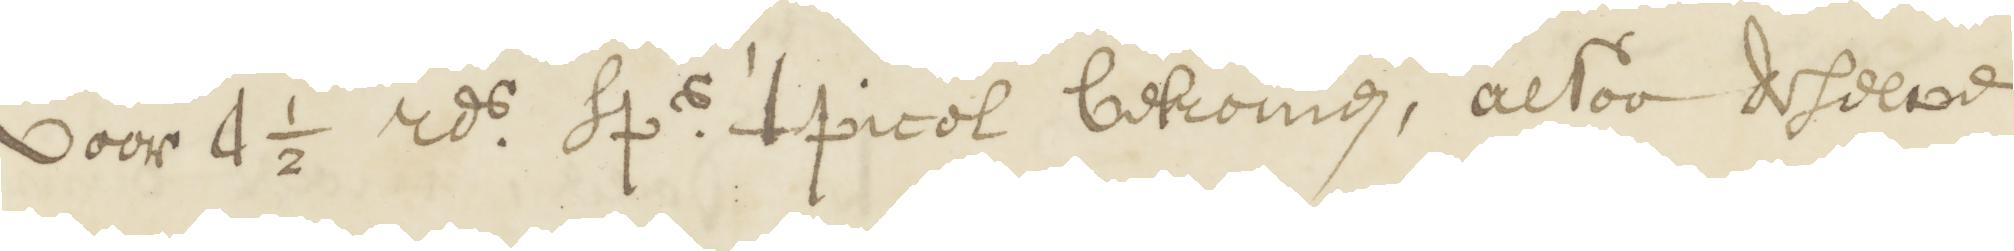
voor 4½ rd.s sp:s 't picol bekomen, alsoo deselve
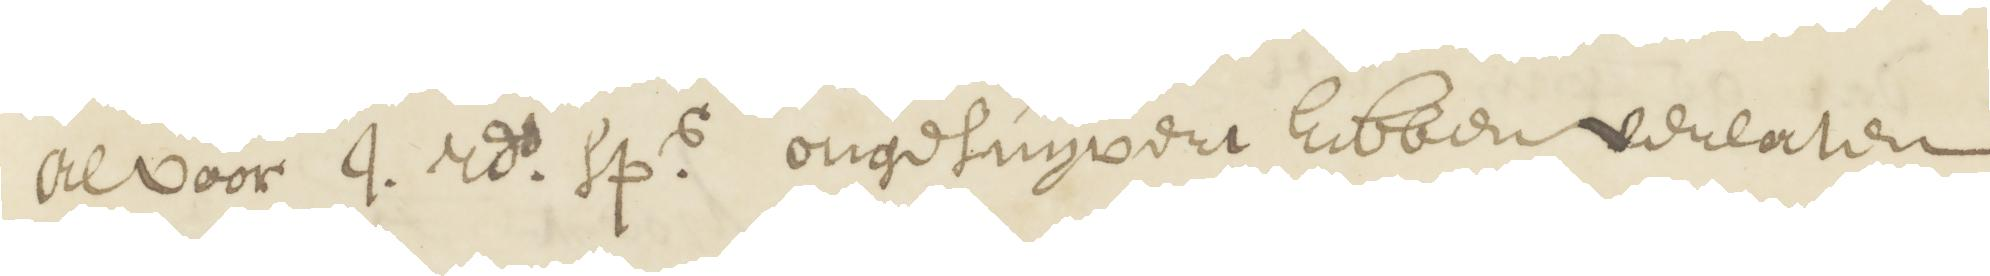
al voor 4. rd.s sp.s ongesuijvert hebben verlaten
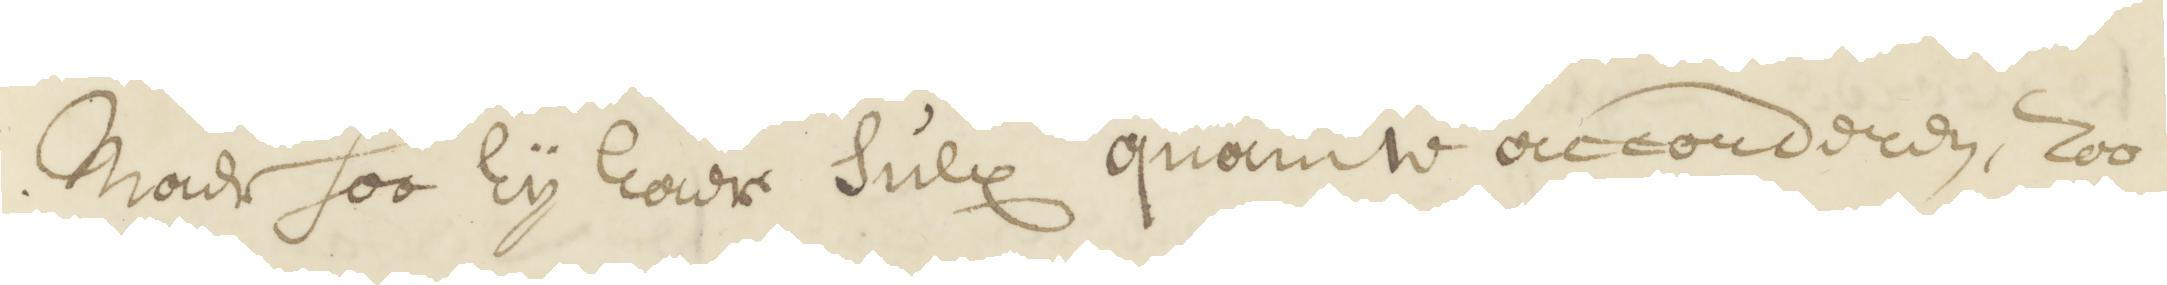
Maer soo hij haer sulx quam te accorderen, zoo
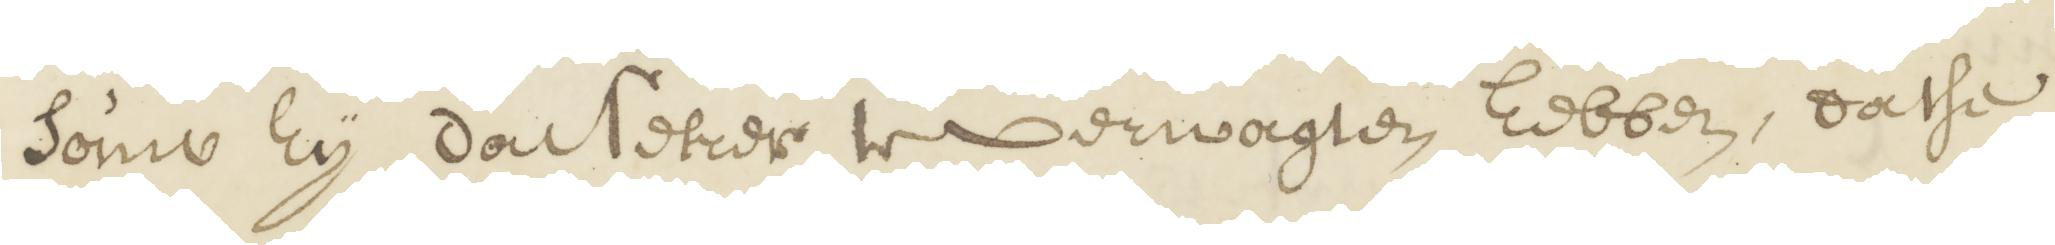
souw hij dat seker te verwagten hebben, datse
